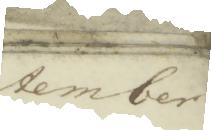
September
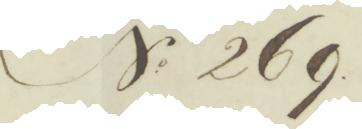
N:o 269.
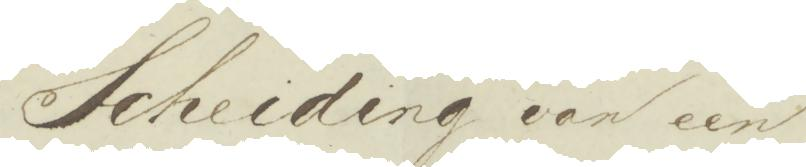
Scheiding van een
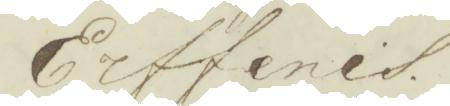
Erffenis.
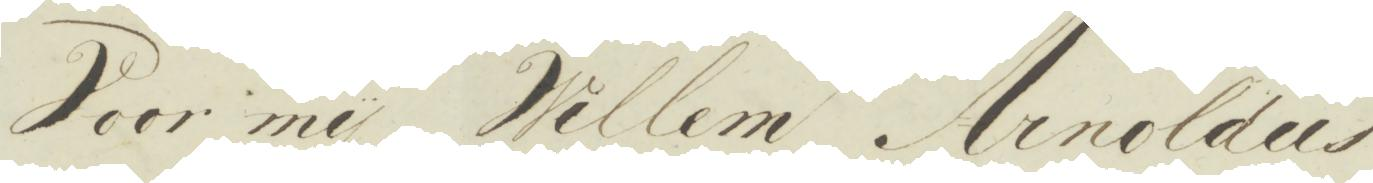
Voor mij Willem Arnoldus
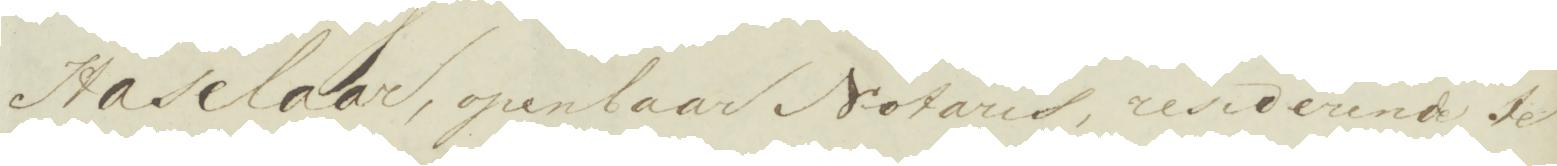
Haselaar, openbaar Notaris, residerende te
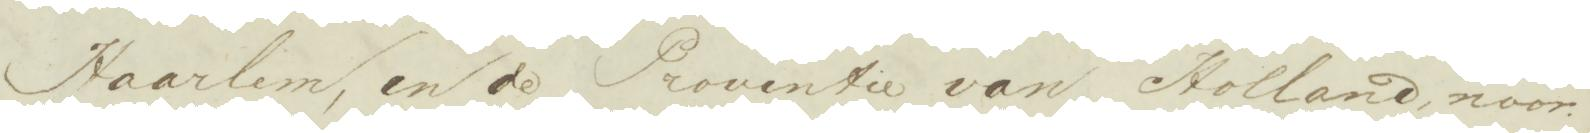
Haarlem, in de Provintie van Holland, noor.
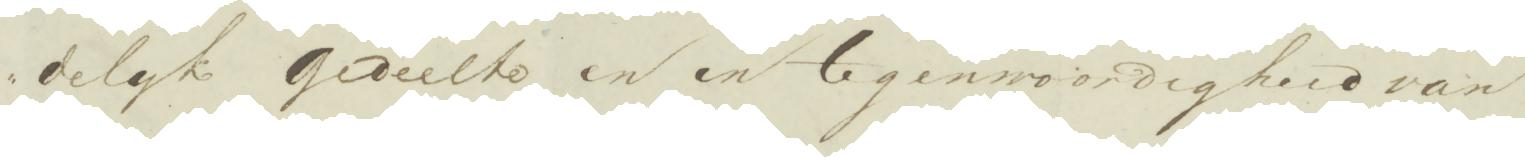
„ delyk gedeelte en in tegenwoordigheid van
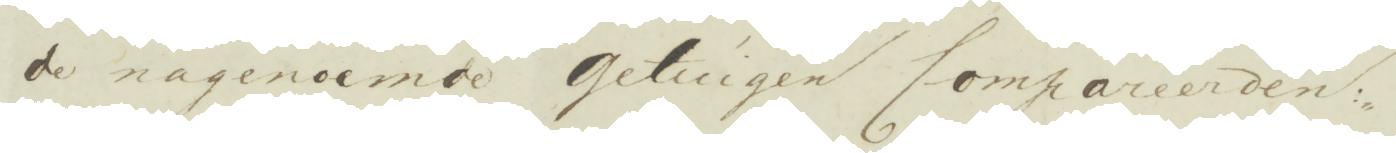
de nagenoemde Getuigen compareerden:„
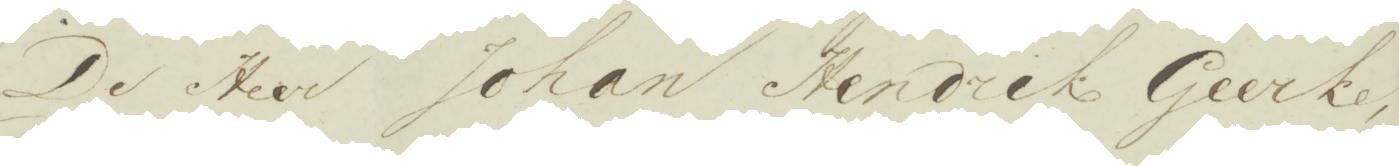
De Heer Johan Hendrik Geerke,
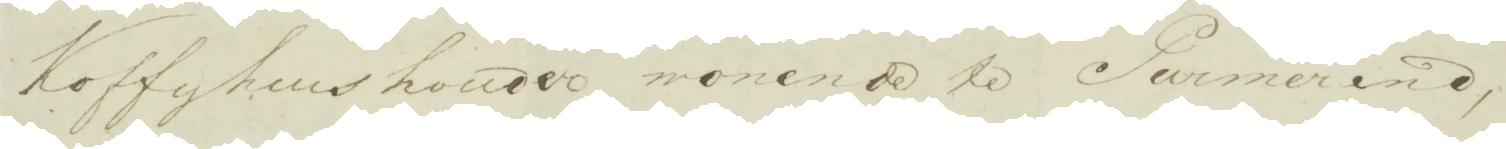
Koffijhuis houder wonende te Purmerend,
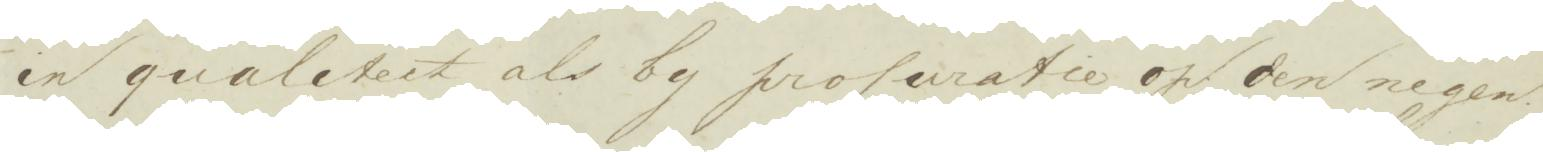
in qualiteit als by procuratie op den negen.
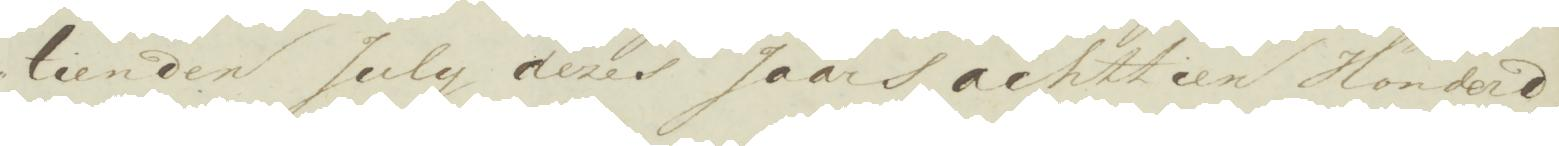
tienden July dezes Jaars achttien Honderd
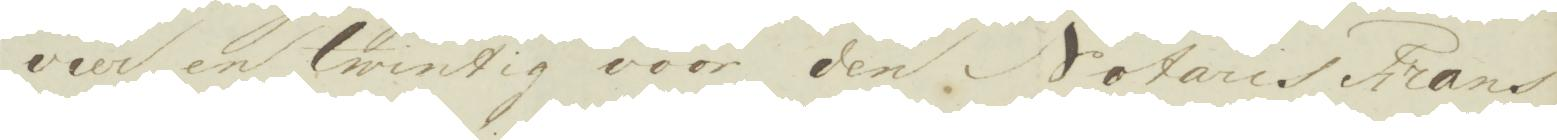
vier en twintig voor den Notaris Frans
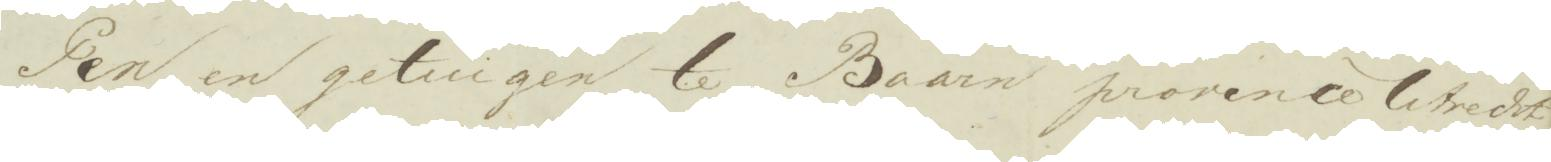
Pen en getuigen te Baarn province Utrecht
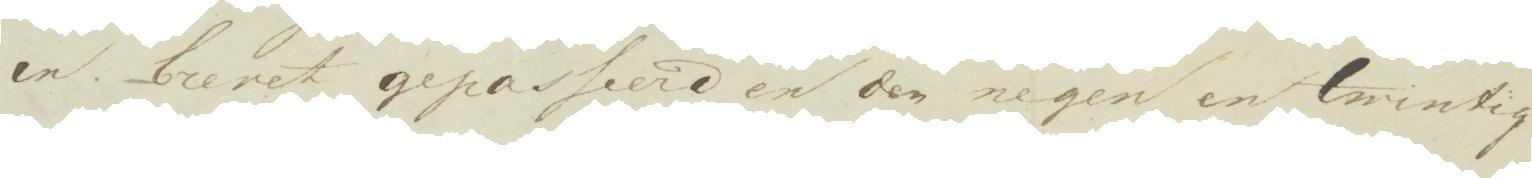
in. brevet gepasseerd en den negen en twintig
